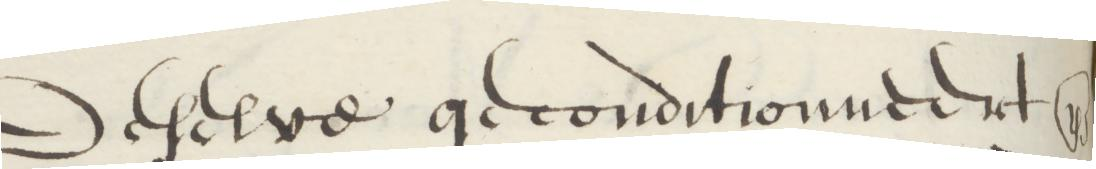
Deselve geconditionneert ende
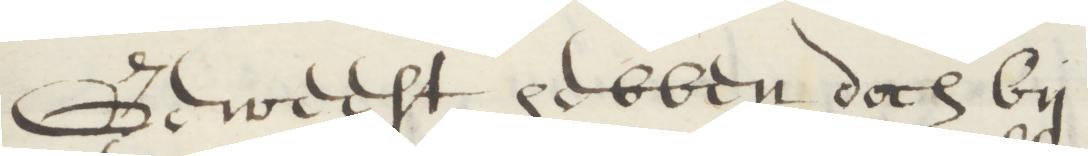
Geweest hebben doch bij
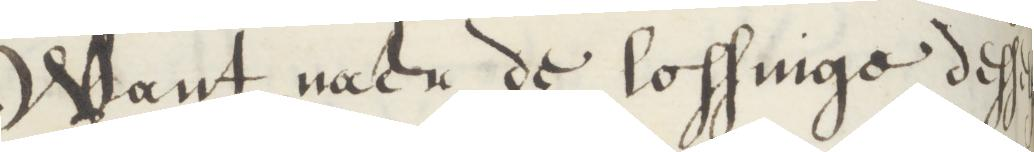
Want naer de lossinge desse
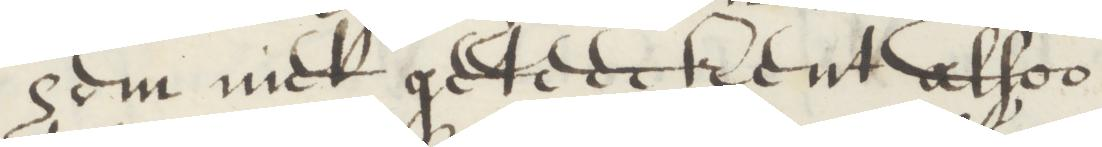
hem niet geteeckent alsoo
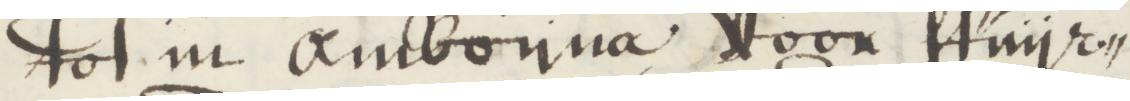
tot in amboijna voor stuijr„
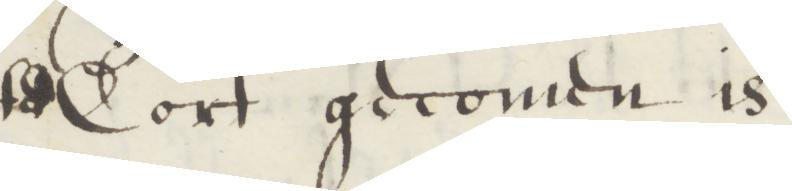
te Cort gecomen is
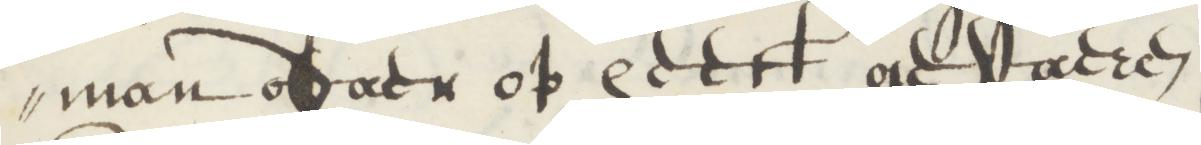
„man odaer op heeft gevaeren
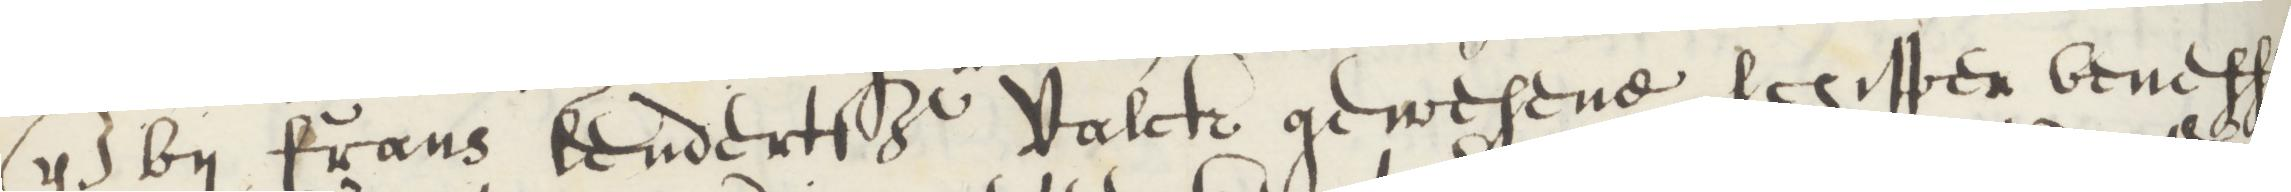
ende bij frans lendertsz valck gewesene schipper beneffe
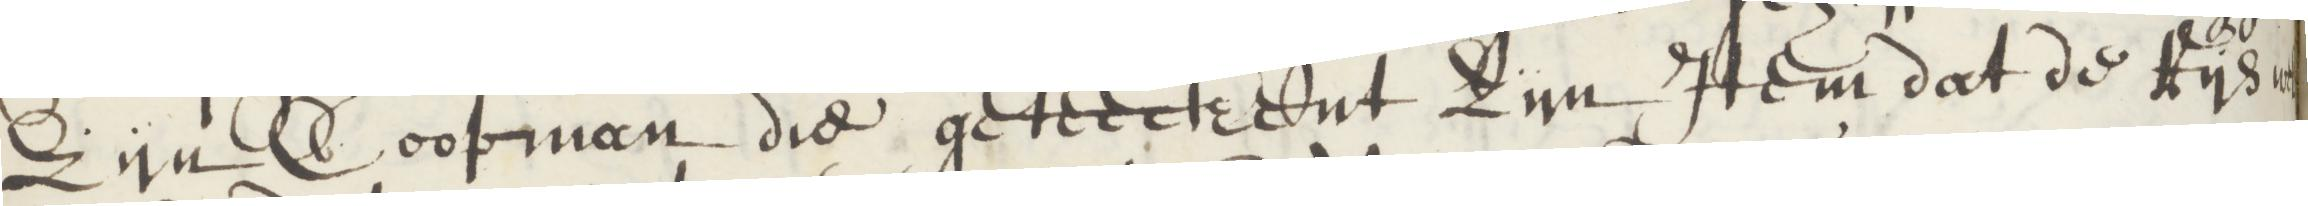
zijn Coopman die geteeckent zijn Jtem dat de Rijs
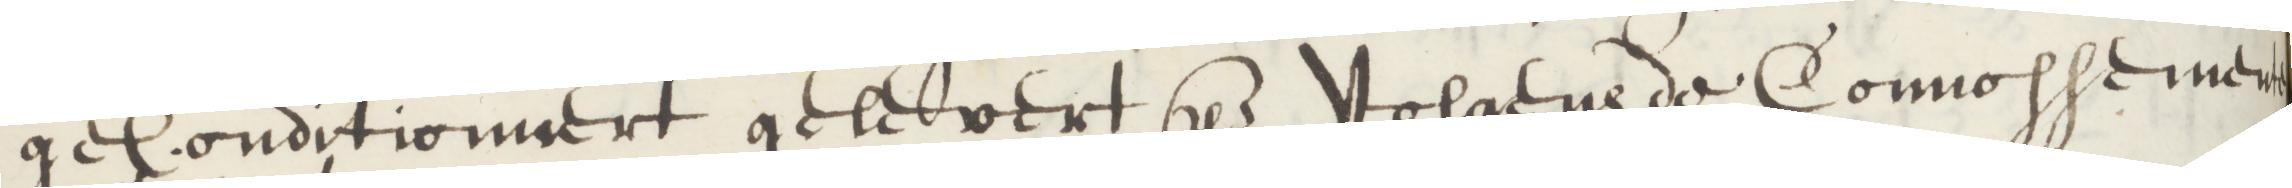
geconditioniert gelevert ende volgens de Connossemente
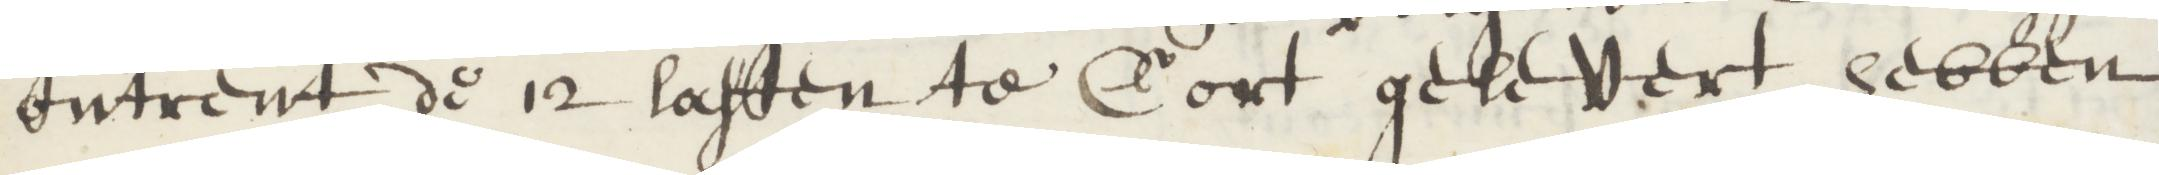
ontrent de 12 lasten te Cort gelevert hebben
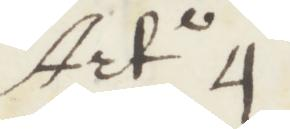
Artl 4
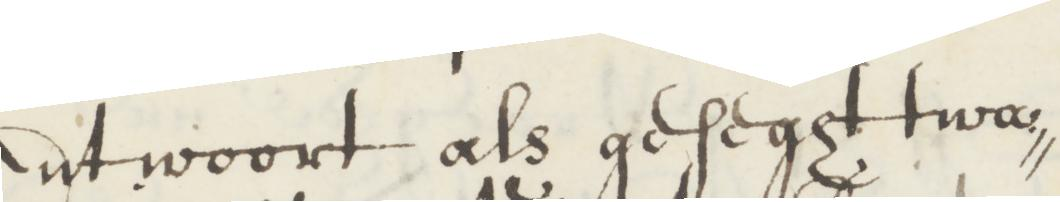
Antwoort als gesegst twa„
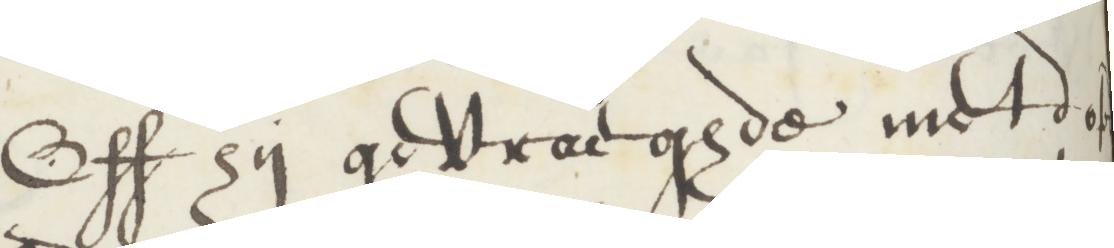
Off sij gevraeghde met d op
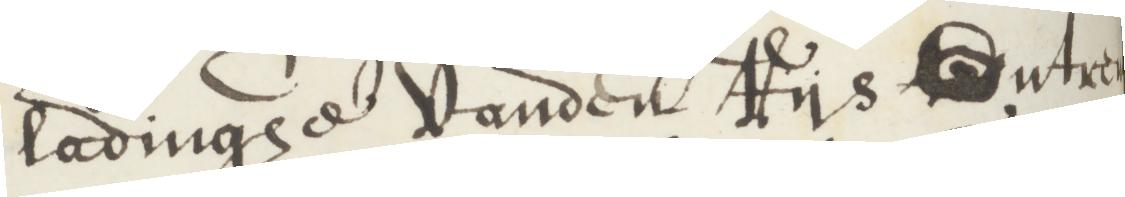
ladinghe vanden Rijs Ontre
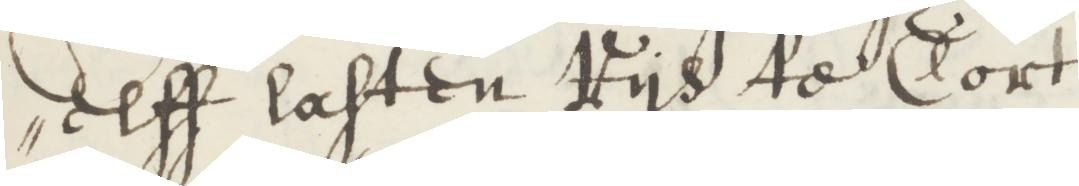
„elff lasten Rijs te Cort
